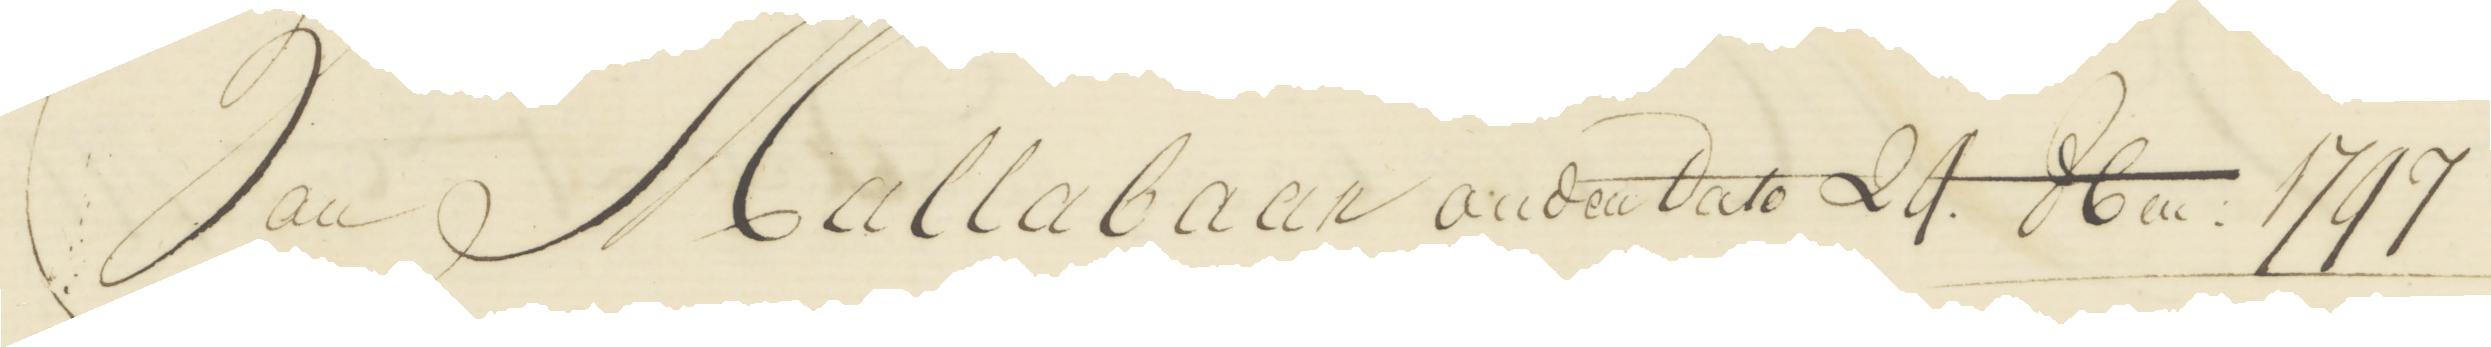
Van Mallabaar onder dato 24: 8ber: 1747
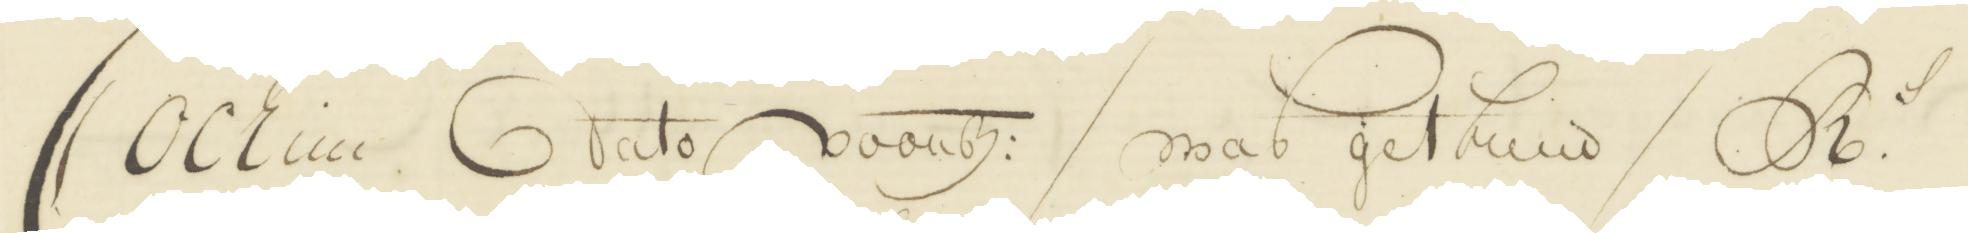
Cochim dato voorsz: /was getkend/ R.s
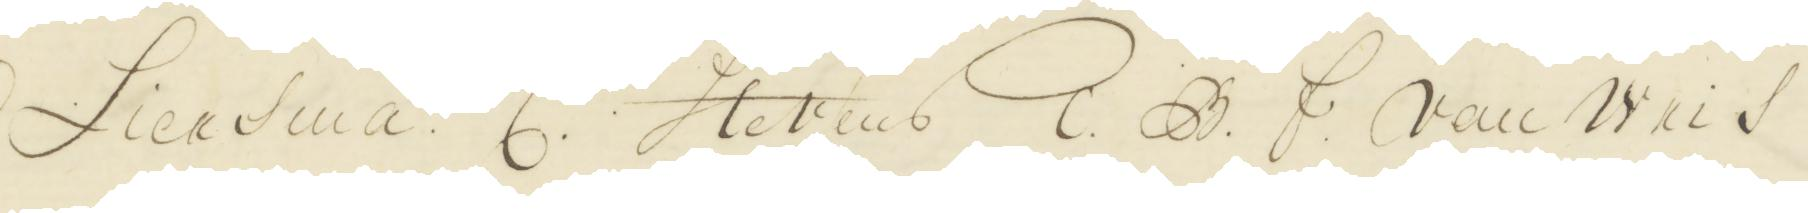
Siersma. C. stevens C. B. f. van wris
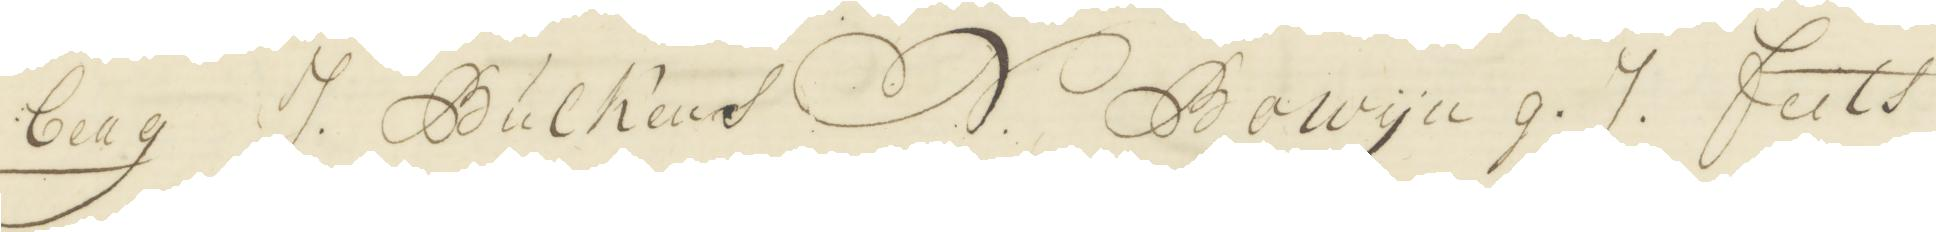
berg J. Bulkens N. Bowijn g. J. feits
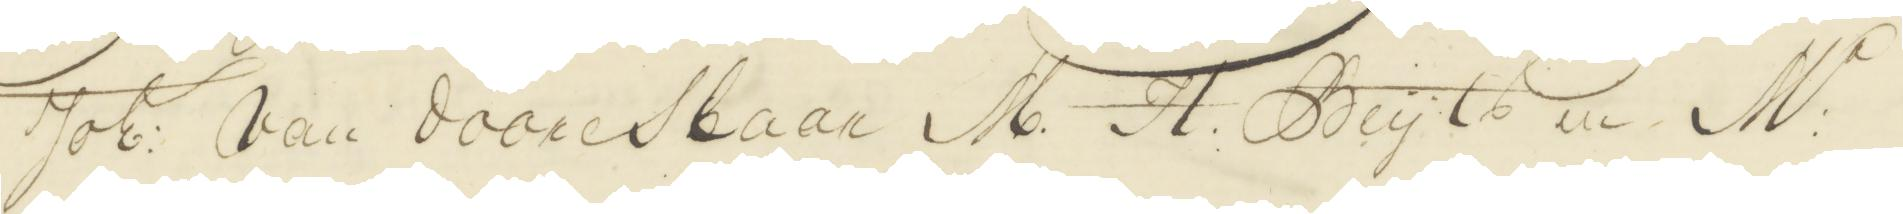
Joh: van dooreslaar M. H: Beijts in M:r
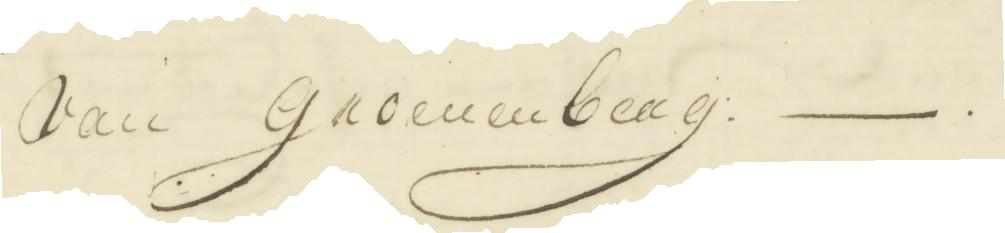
van groenenberg: —.
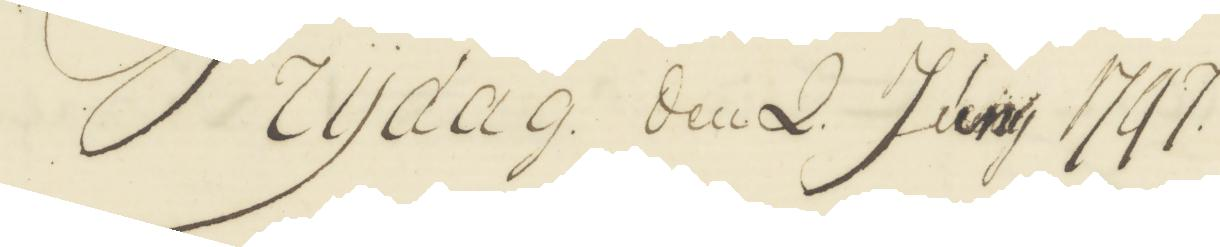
Vrijdag. den 2. Junij 1747.
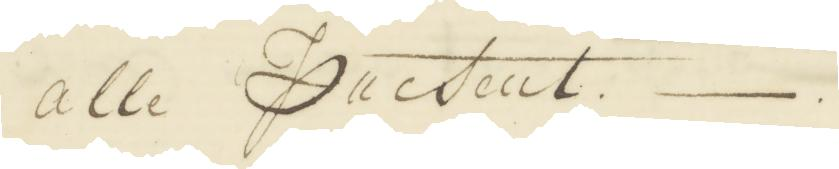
alle present. —.
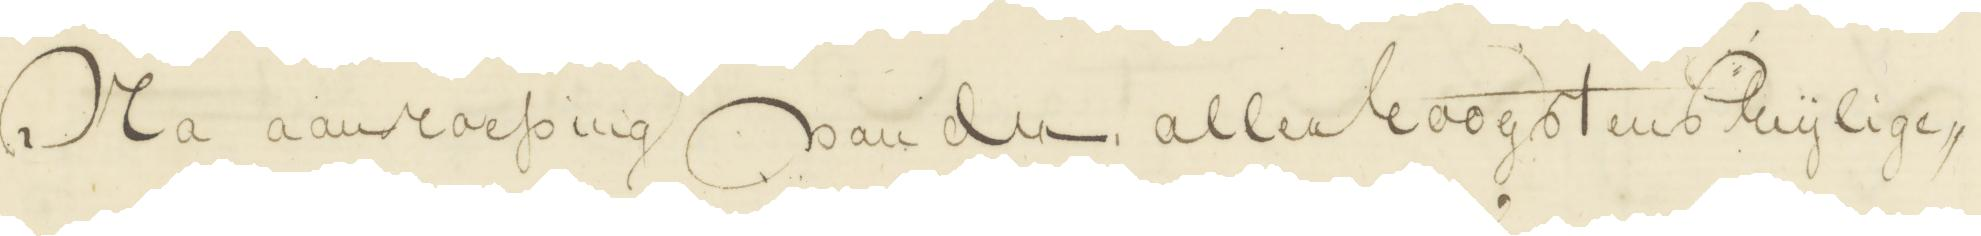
Na aanroeping van den aller hoogstens heijlige„
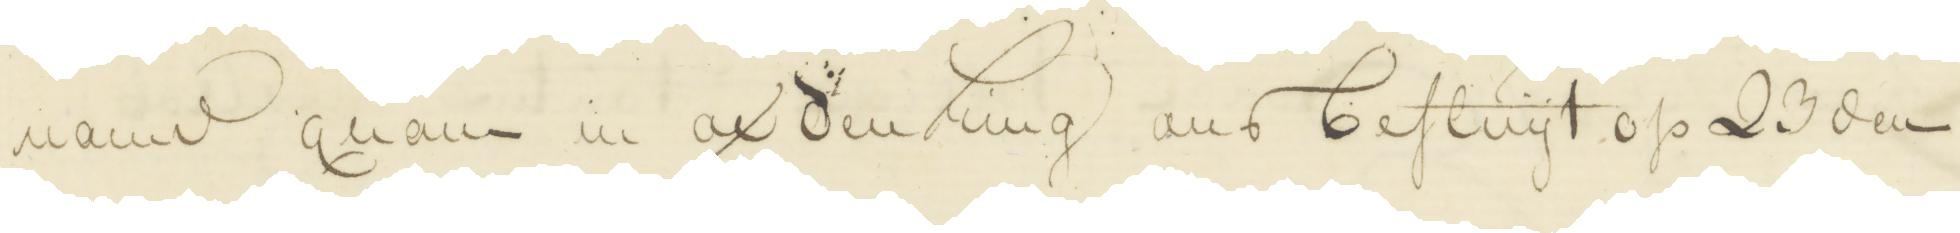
name quam in overdenking onsbesluijt op 23 den
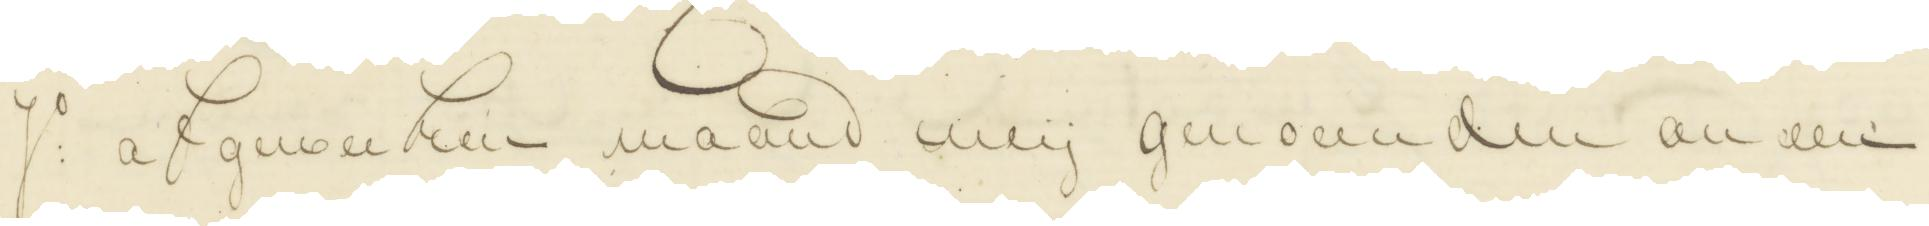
J:o afgeweeken maand meij genoemden en een
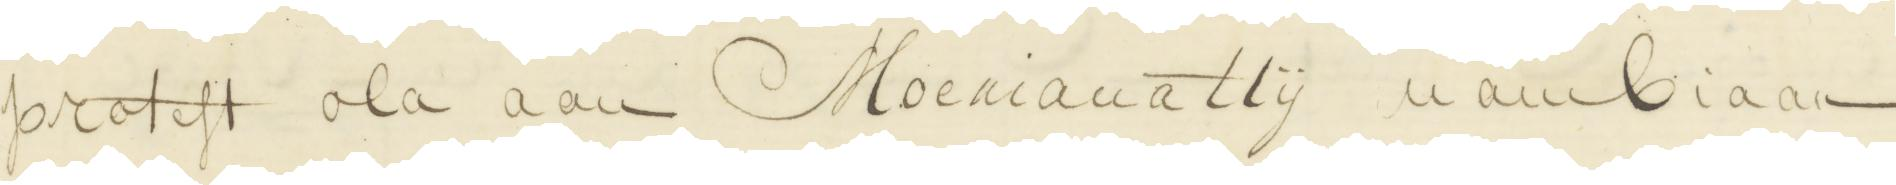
protest ola aan Moerianattij nambiaar
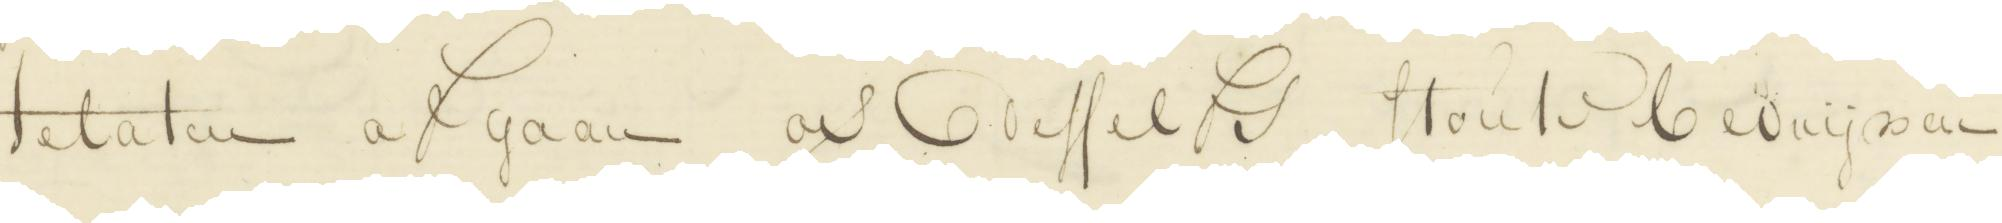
telaten afgaan overdesselfs stoute bedrijven
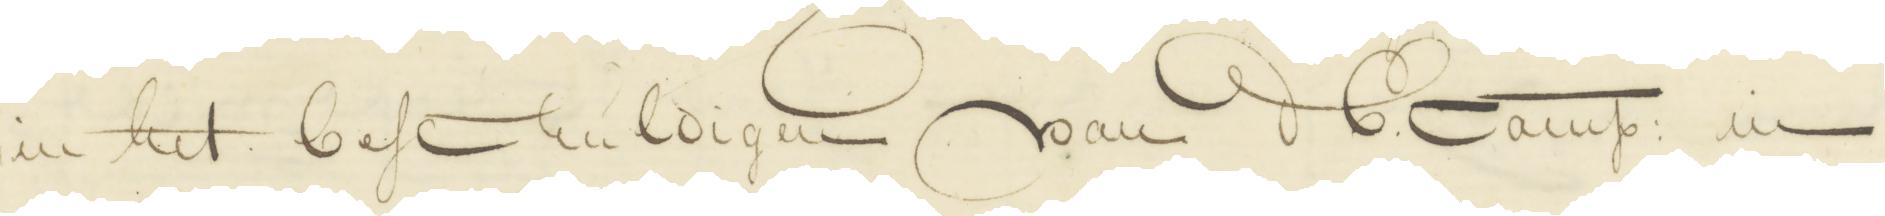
in het beschuldigen van dE: Comp: in
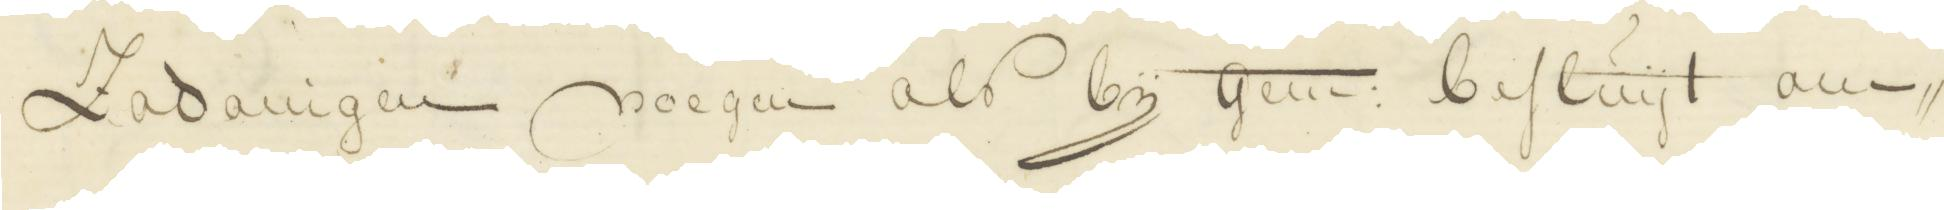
zodanigen voegen als bij gem: besluijt om„
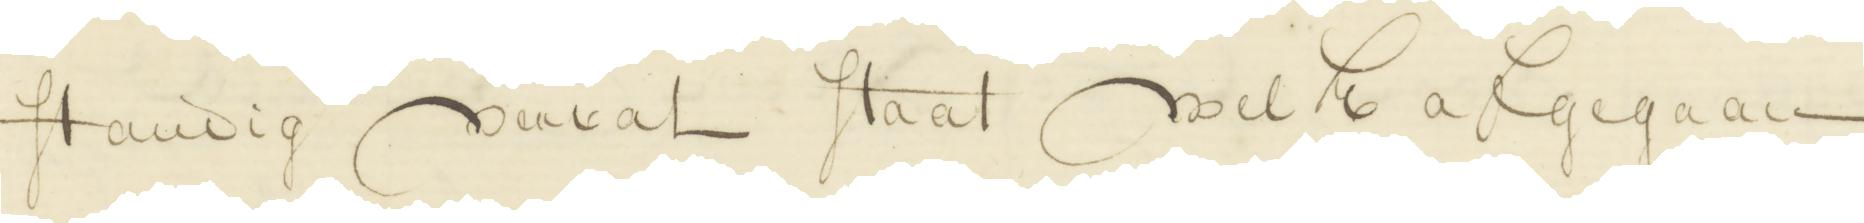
standig vervat staat welk afgegaan
